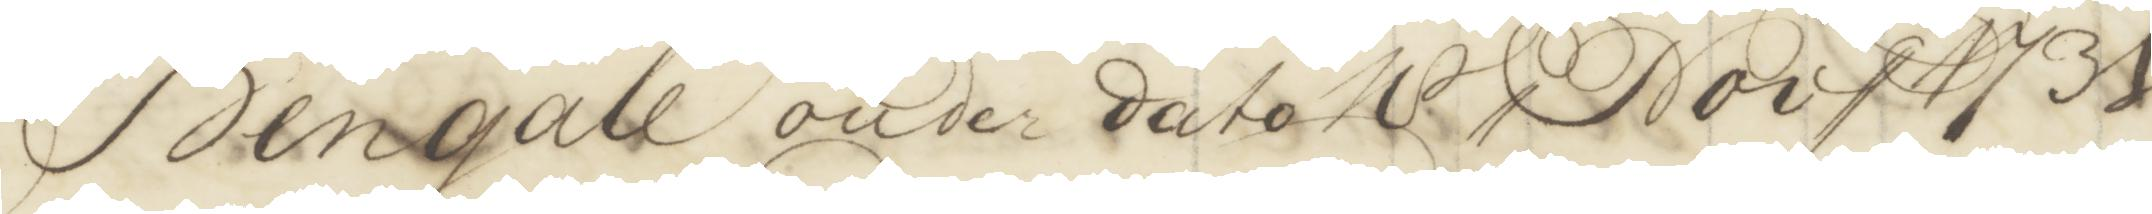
V Bengale onder dato 18„' Nov„ 1731:
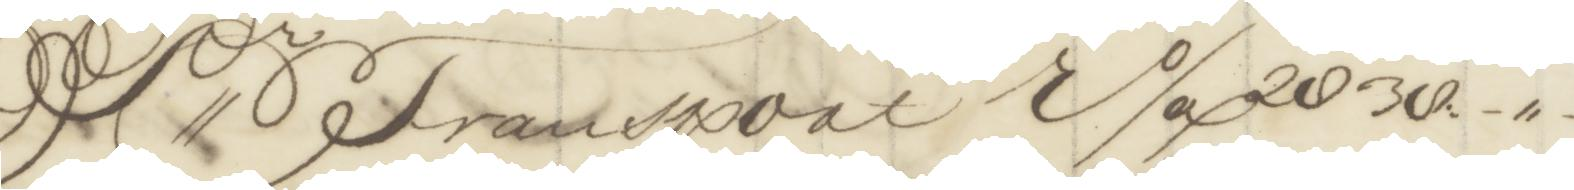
P„r Transport ro/a 2838:-„
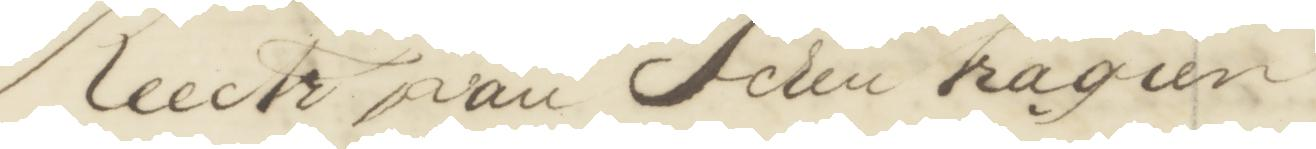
Reeck van Schenkagien
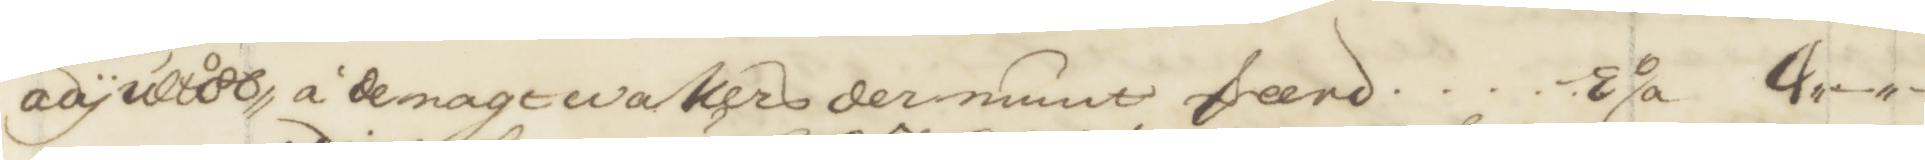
adij ulto8b„ a 'de nagtwakers der munt vereerd. . . . . r o/a 4„—„
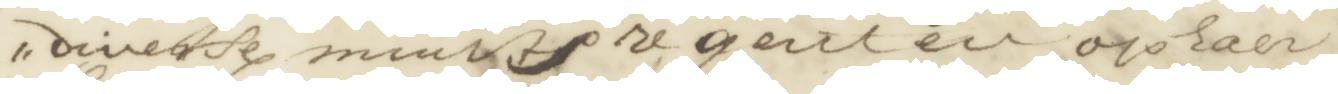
„diverse munts regenten op haer
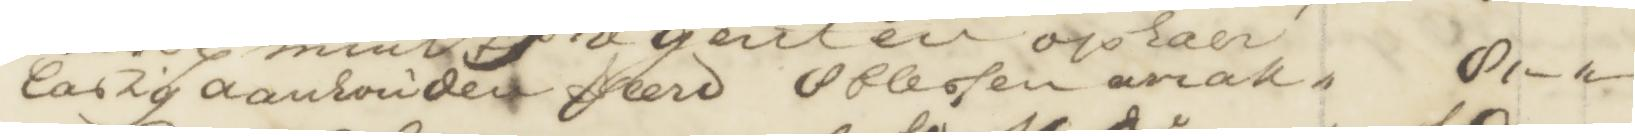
lastig aanhouden vereerd 8 flessen arrak„ 8,—„—
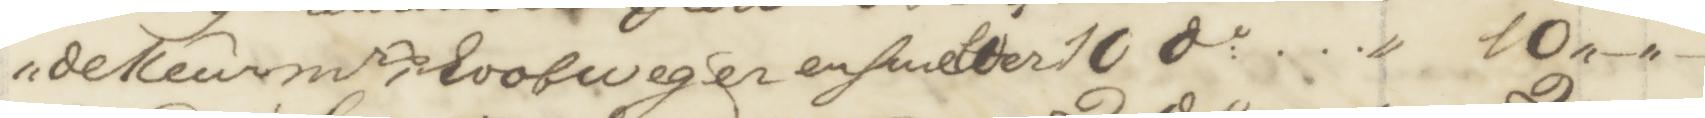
„dekeurm,rs hoofweger en smelter 10 d:o . . . „ 10„—„—
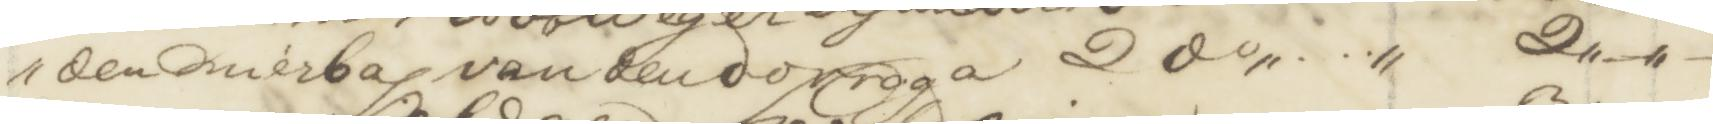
„den mierbas van den darroga 2 d„o „. . .„ 2„—„—
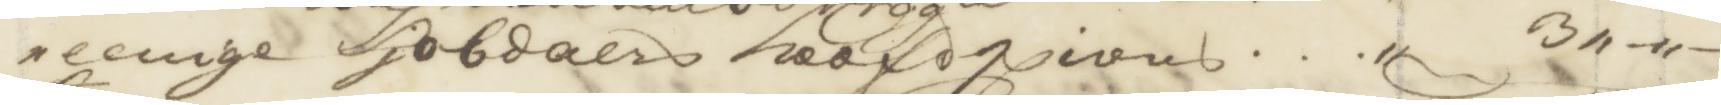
„eenige sjobdaer hoofdpiens„ 3 – –„
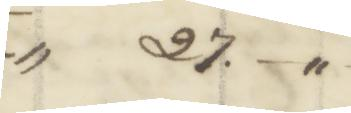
„ 27.—„
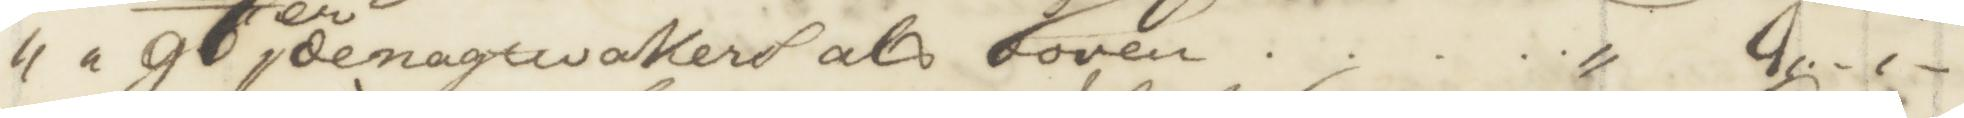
„ „ 9„ber de nagtwakers als boven . . . . . „ 4„ - , —
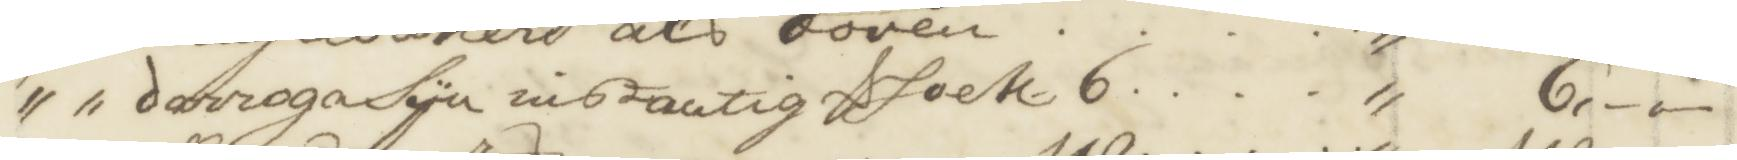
„ „ darroga sijn instantig versoek 6. . . . „ 6,—„—
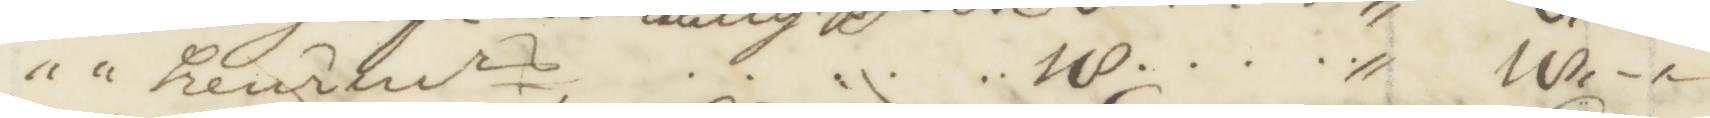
„„ heur m-rs, . . , . .. 18. . . . . „ 18, —„—
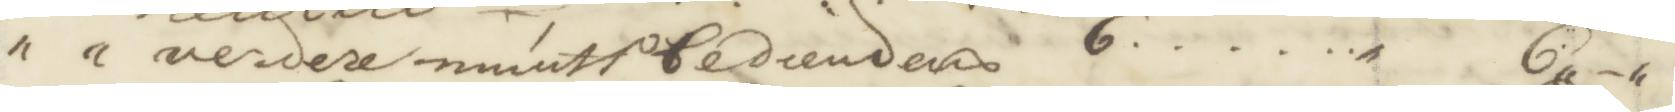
„ „ verdere munts bedienden 6. . . . . . „ 6 „ - „
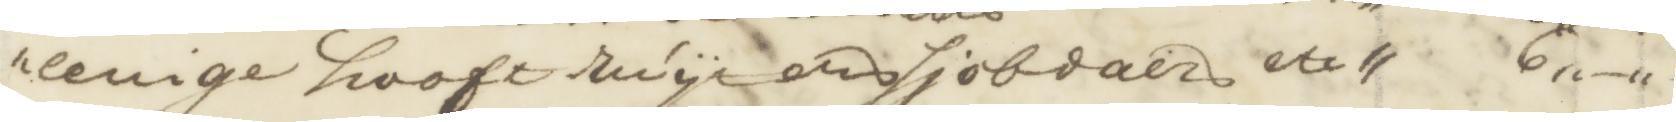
„eenige hooft ruijters sjobdaer etc„ 6 „-„
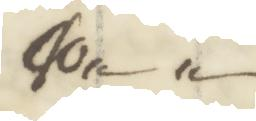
40„— „—
